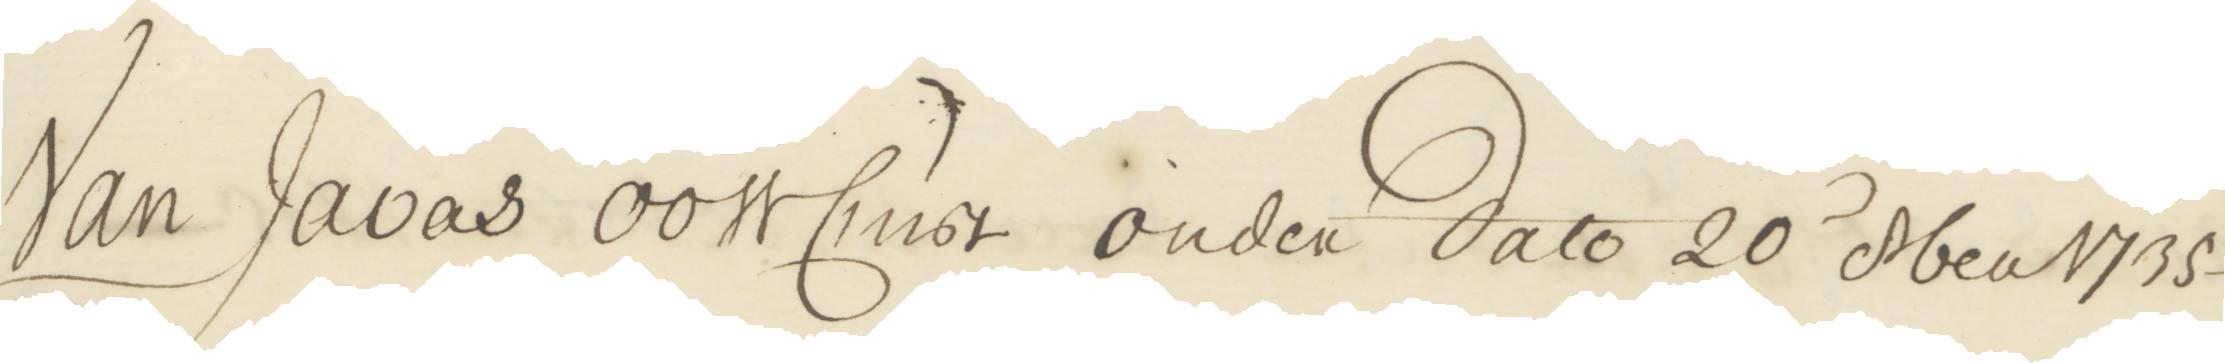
Van Javas oost Cust onder dato 20' 8ber 1735
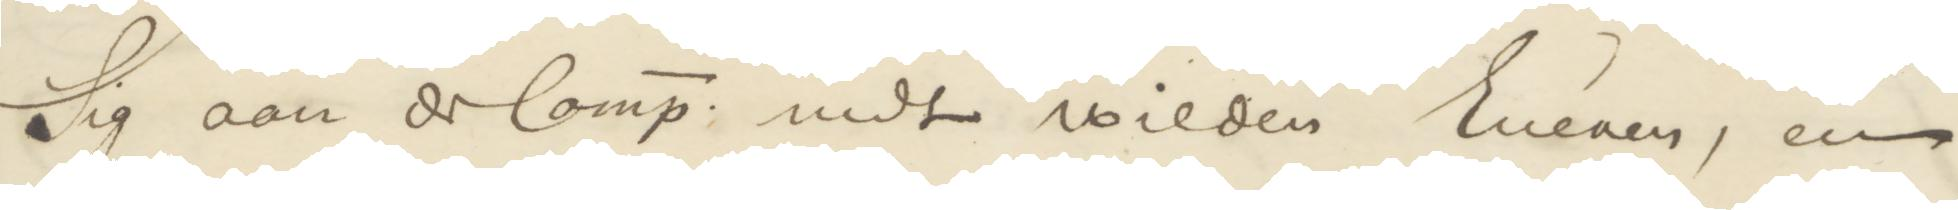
sig aan deComp: niet wilden hueren, en
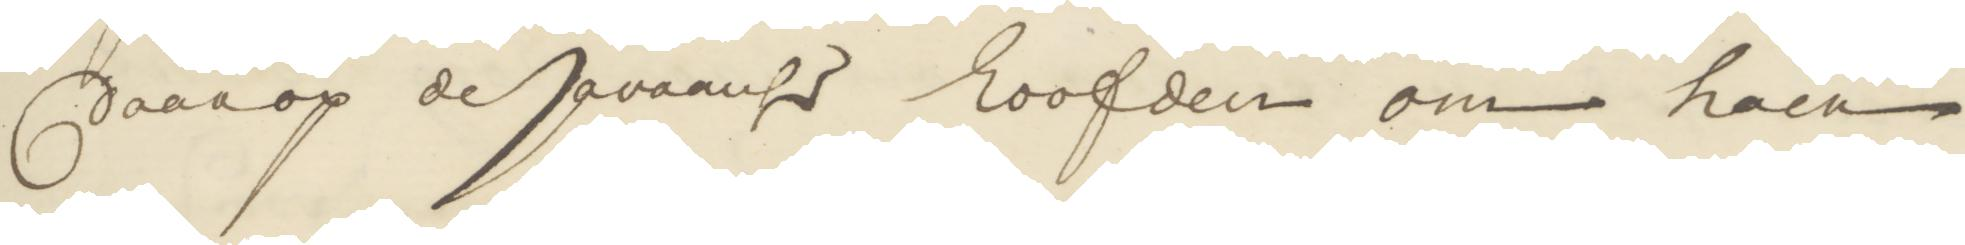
daarop deJavaanse hoofden om haer
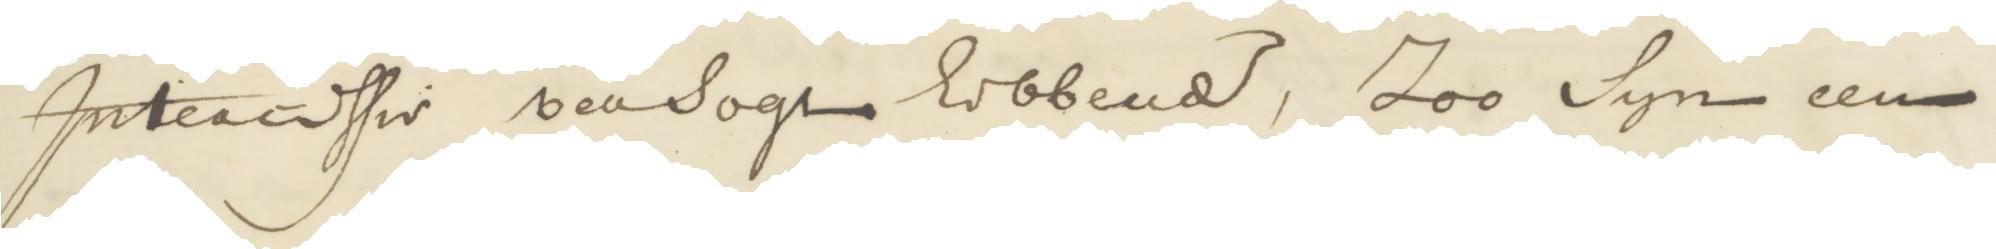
Intercessie versogt hebbende, zoo sijn een
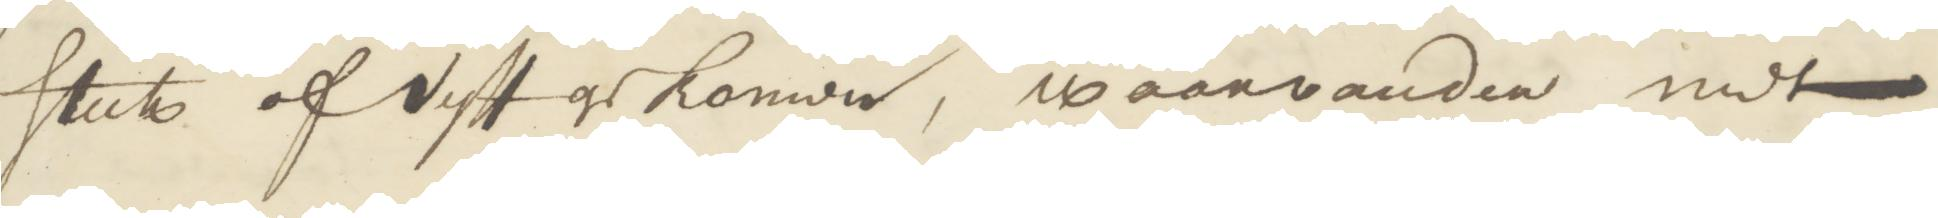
stuk of vijff gekomen, waarvander met
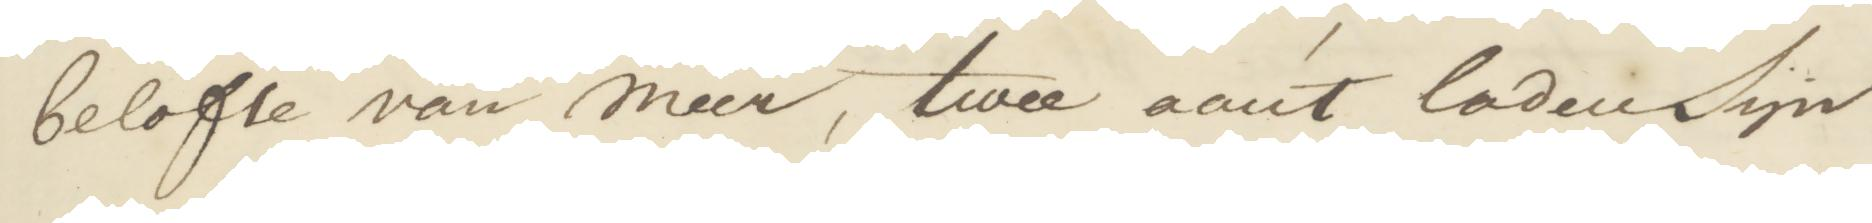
belofte van meer, twee aan't ladensijn
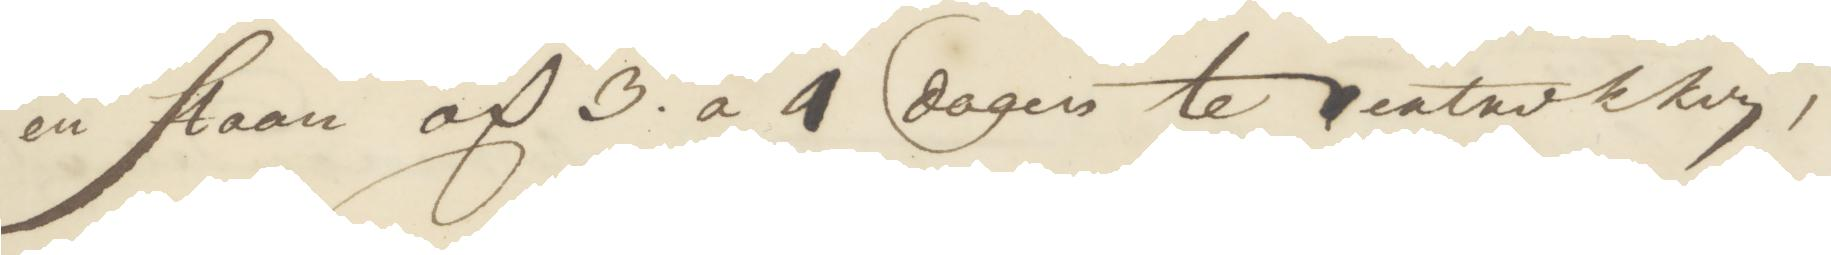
en staan over 3. â 4 dagen te vertrekken,
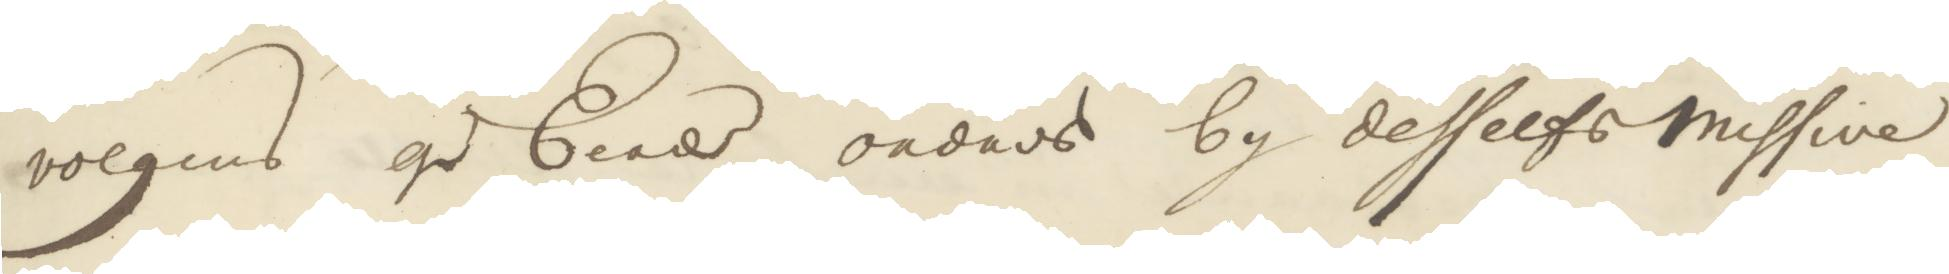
volgens geEerde ordres bij desselfs missive
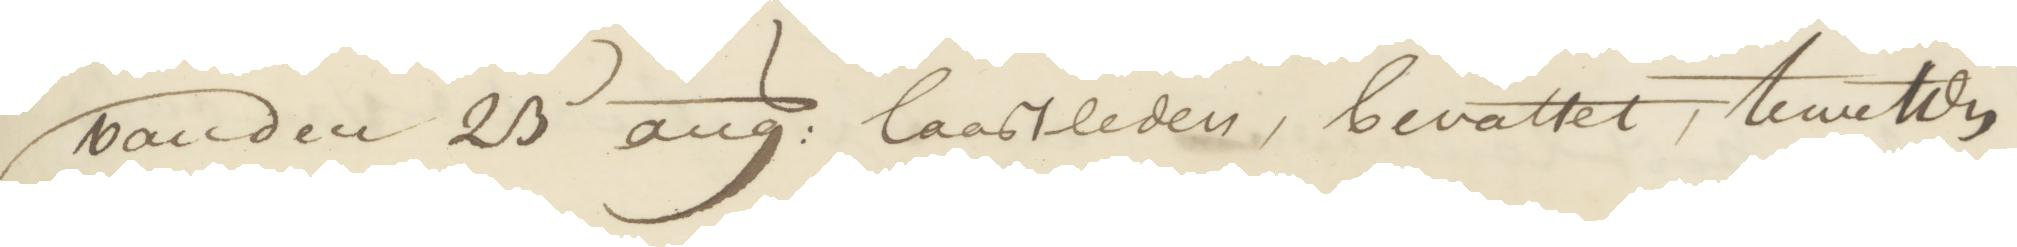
van den 23 aug: laastleden, bevattet, teweten
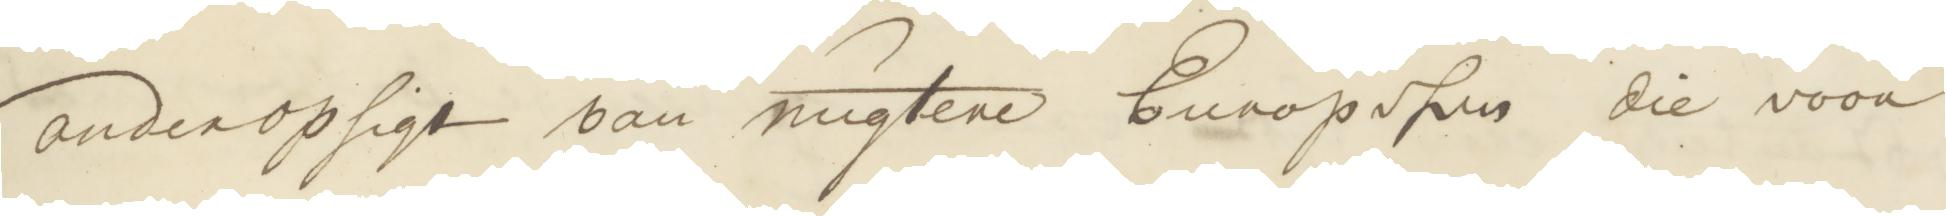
onderopsigt van nugtere Europesen die voor
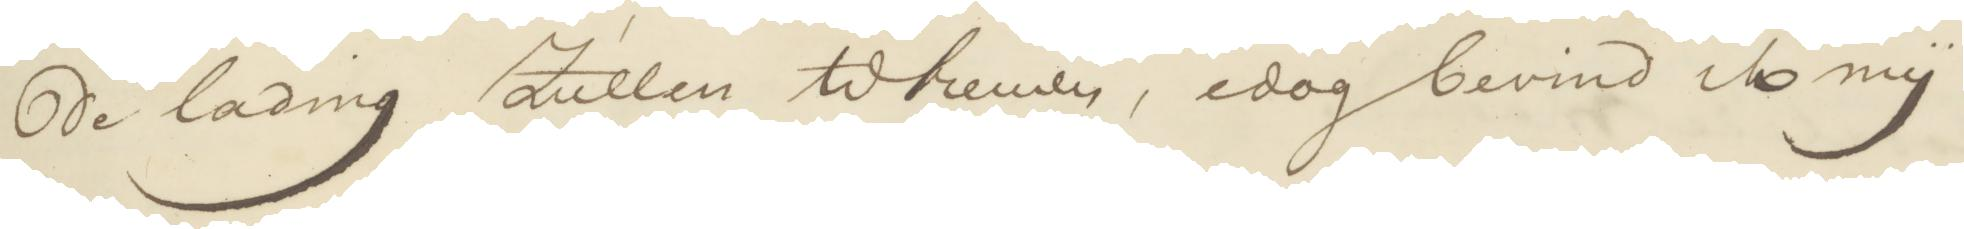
de lading zullen tekenen, edog bevind ik mij
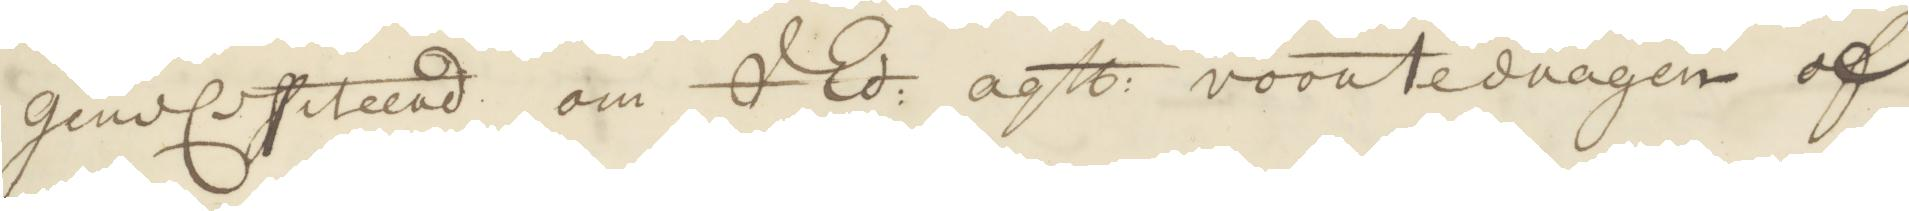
genecessiteerd om VEd: agtb: voortedragen of
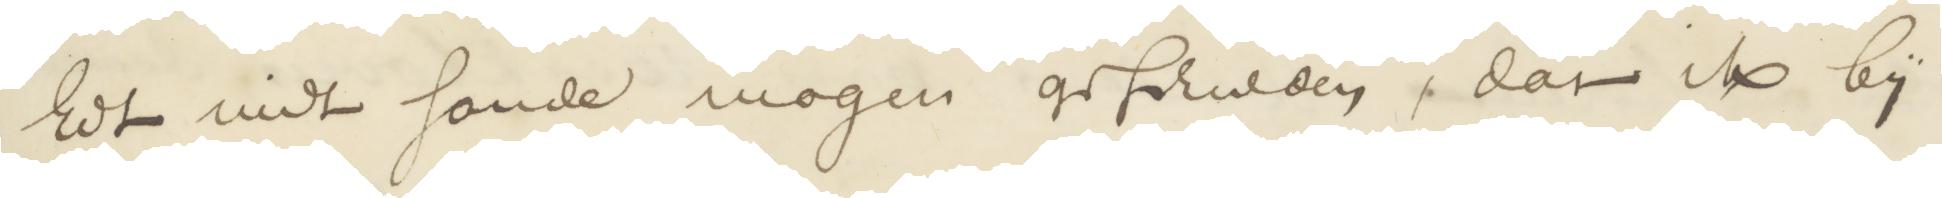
het niet soude mogen geschieden, dat ik bij
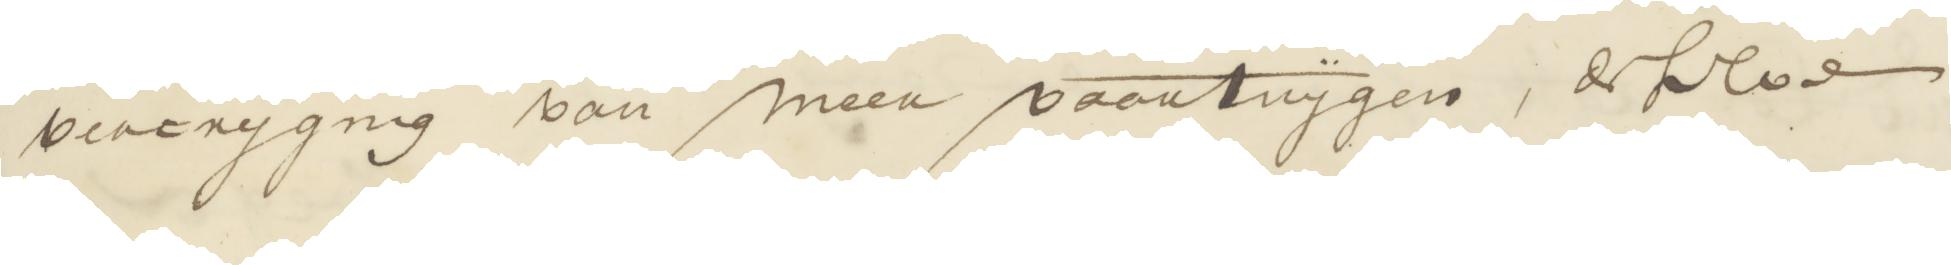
vercrijging van meer vaartuijgen, deselve
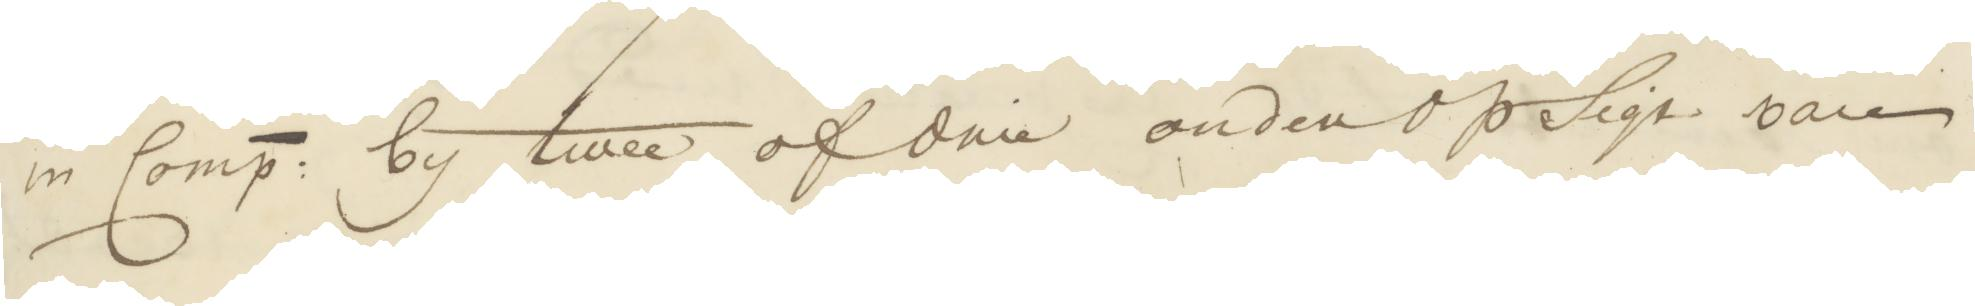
in Comp: bij twee of drie onder opsigt van
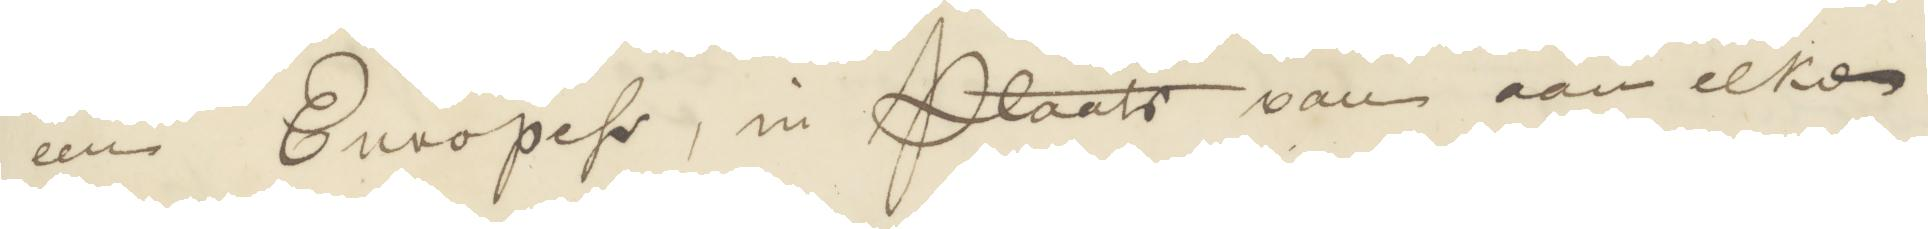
een Europese, in Plaats van aan elke
